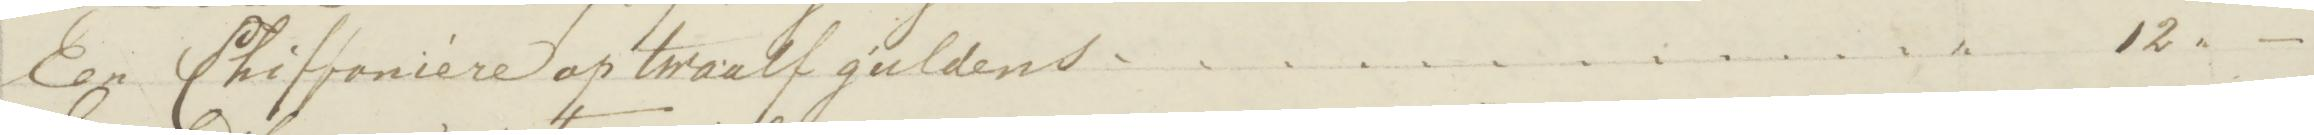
Een Chiffoniere op twaalf guldens - - - - - - - - - - „ 12„ —
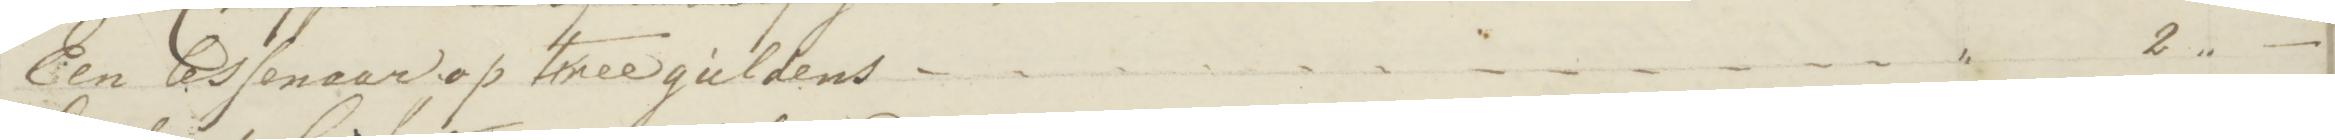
Een lessenaar op twee guldens - - - - - - - - - - - „ 2 „ —
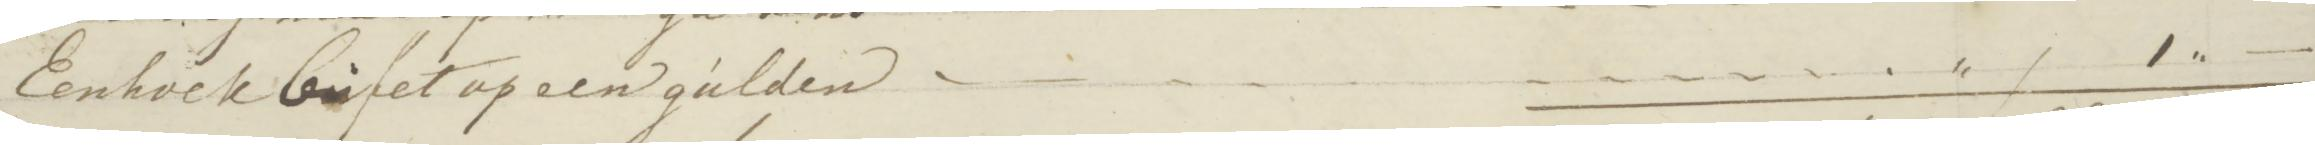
Eenhoekbufet op een gulden - - - - - - - - - - - - „ 1„ —
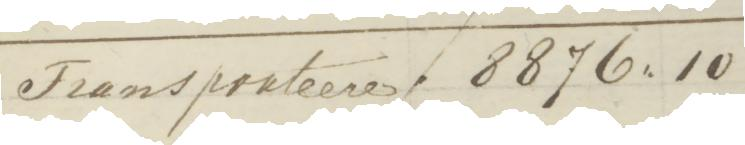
Transporteere ƒ 8876„ 10
